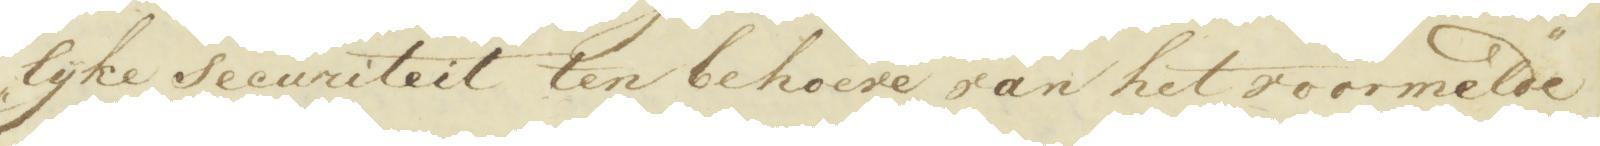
lijke securiteit ten behoeve van het voormelde
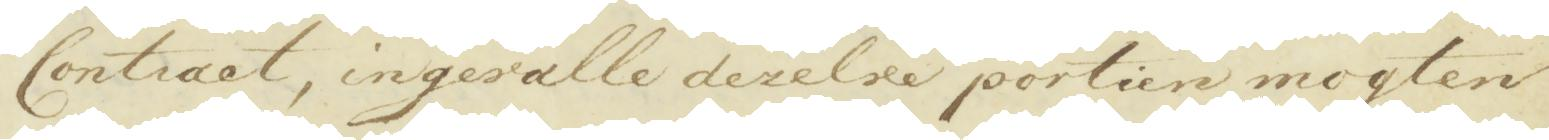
Contract, ingevalle dezelve portien mogten
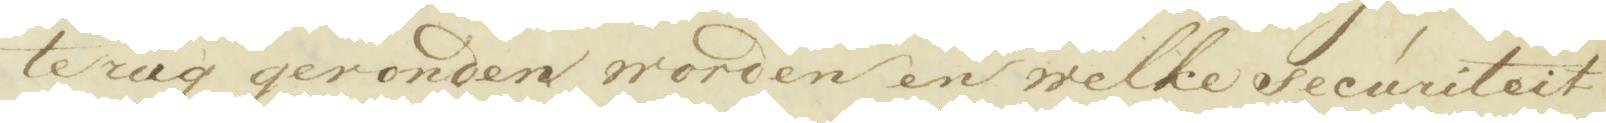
te rug gevonden worden en welke securiteit
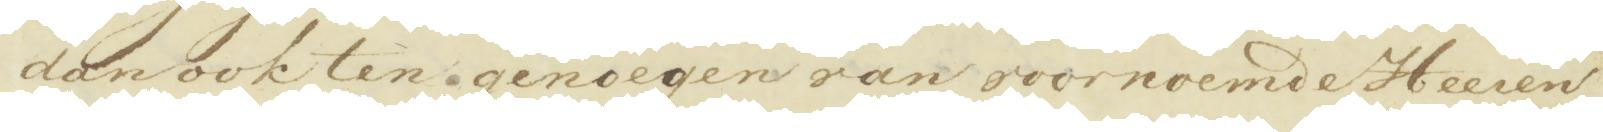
den ook ten genoegen van voornoemde Heeren
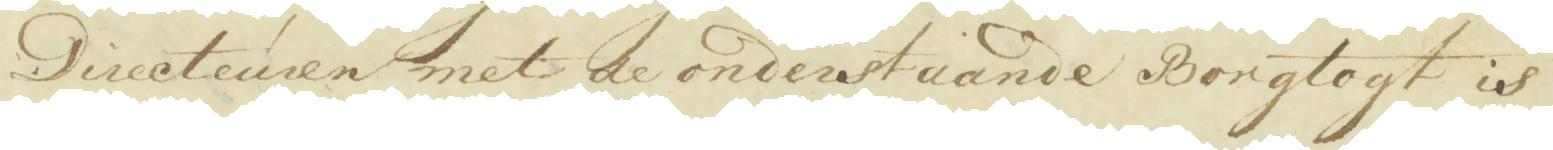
Directeuren met de onderstaande Borgtogt is
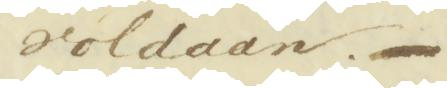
voldaan.—
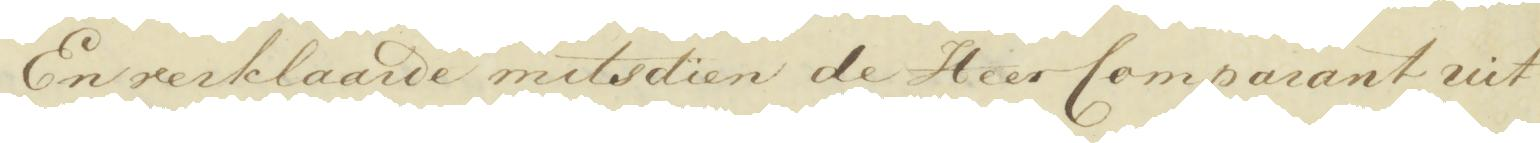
En verklaarde mitsdien de Heer Comparant uit
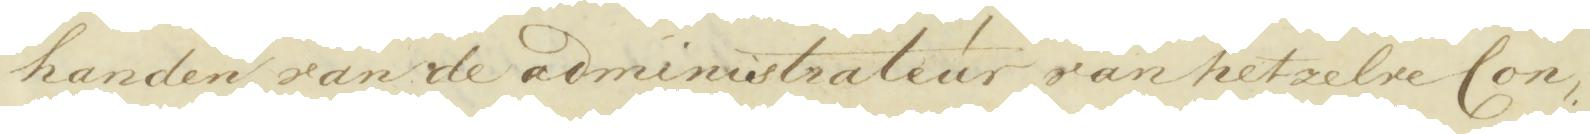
handen van de administrateur van hetzelve Con„
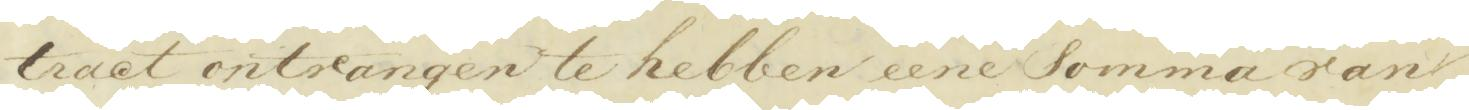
tract ontvangen te hebben eene somma van
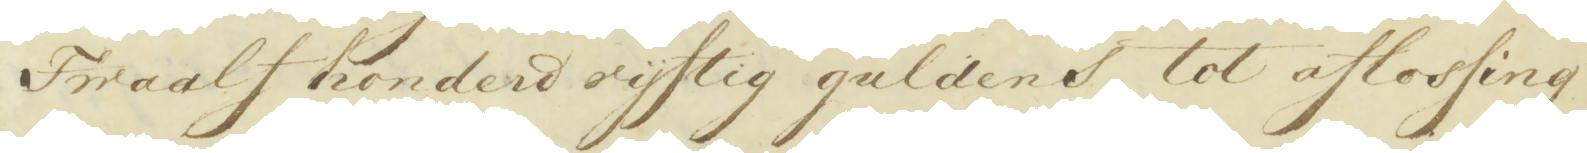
Twaalf honderd vijftig guldens, tot aflossing
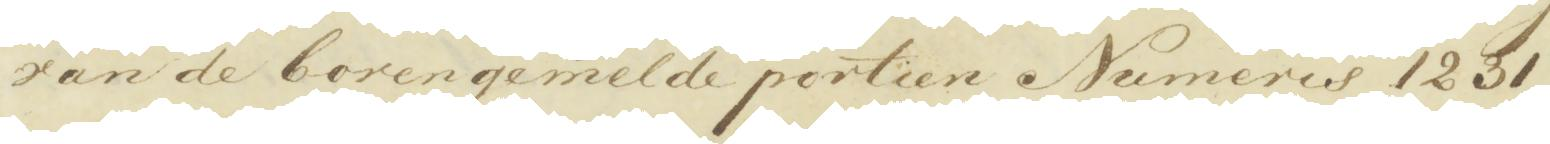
van de bovengemelde portien Numeris 1231
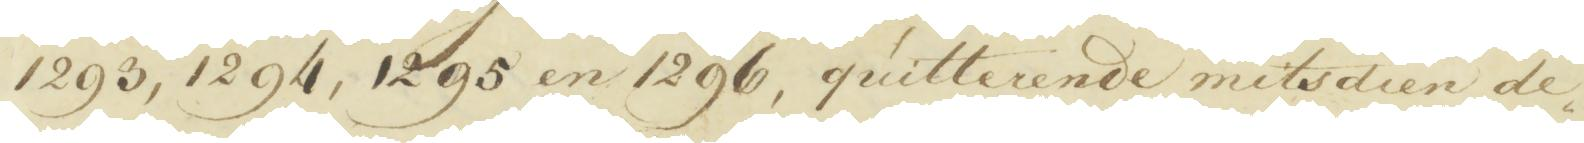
1293, 1294, 1295 en 1296, quitterende mitsdien de„
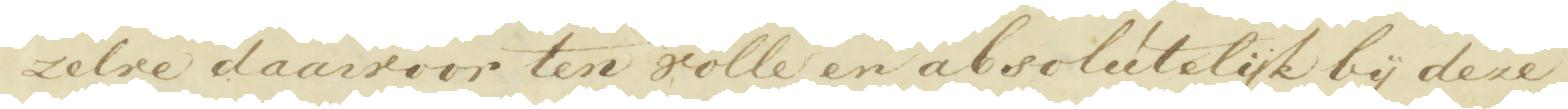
zelve daarvoor ten volle en absolutelijk bij deze
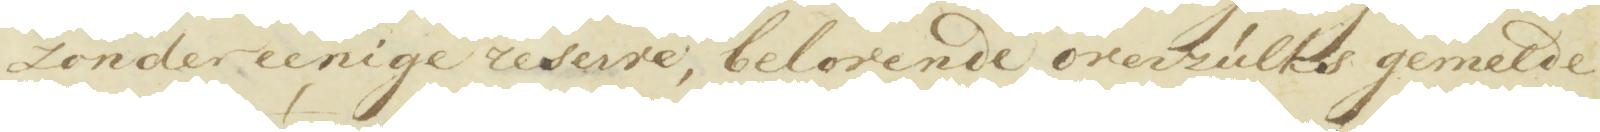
zonder eenige reserve, belovende overzulks gemelde
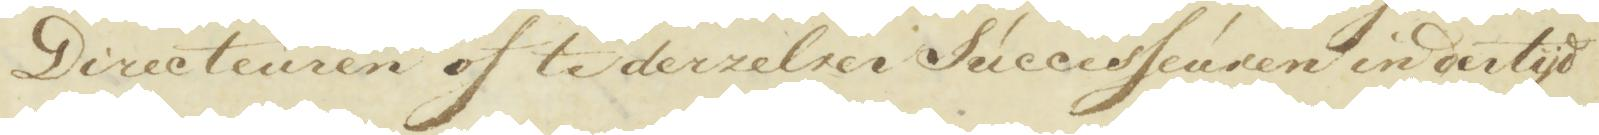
Directeuren of te derzelver Successeuren in der tijd
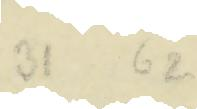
31 62
